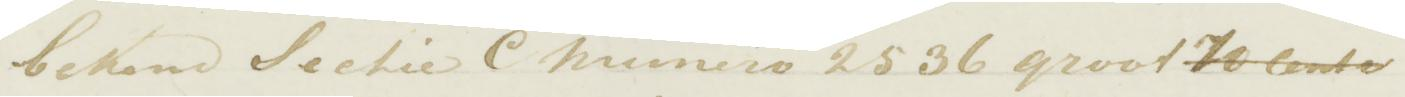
bekend Sectie C numero 2536 groot 70 centi
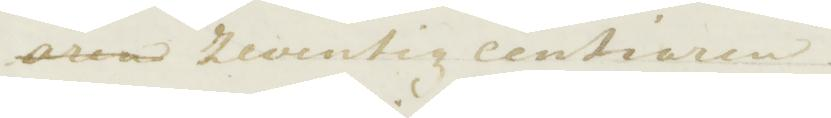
aren Zeventig centiaren
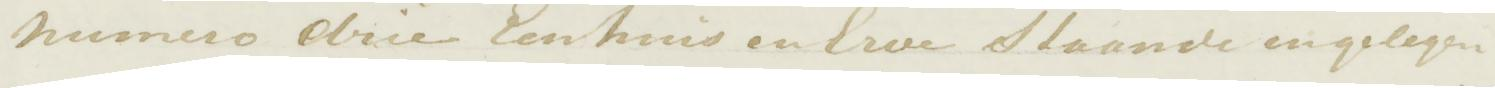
numero drie Een huis en Erve staande en gelegen
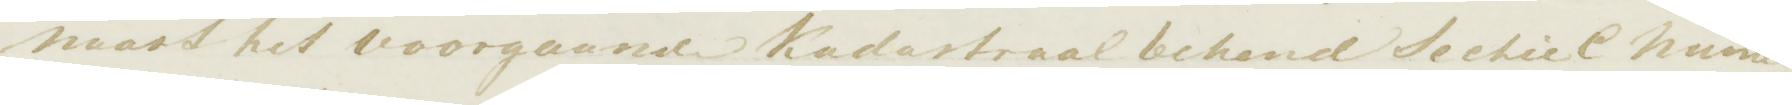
naast het voorgaande Kadastraal bekend sectie C nume
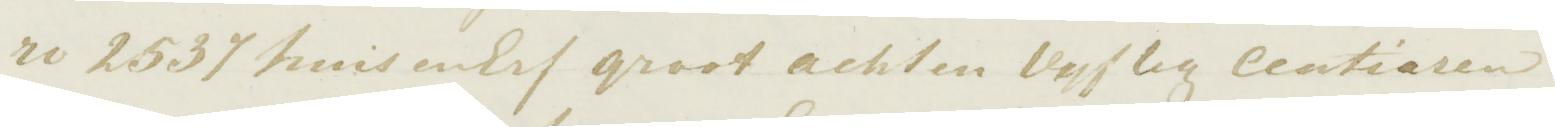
ro 2537 huis en Erf groot achten Vyftig centiaren
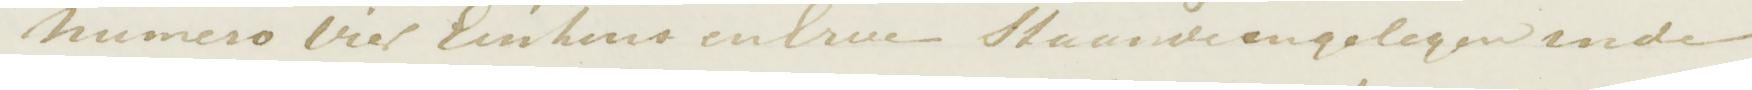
numero vier Een huis en Erve staande en gelegen in de
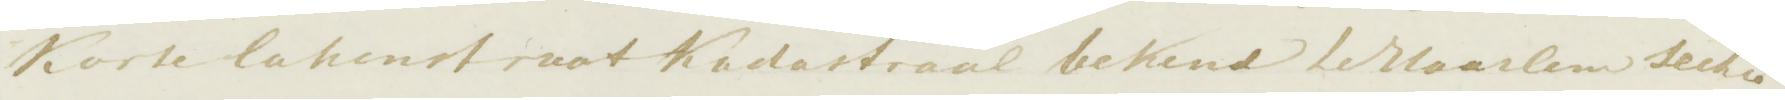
Korte lakenstraat Kadastraal bekend te Haarlem sectie
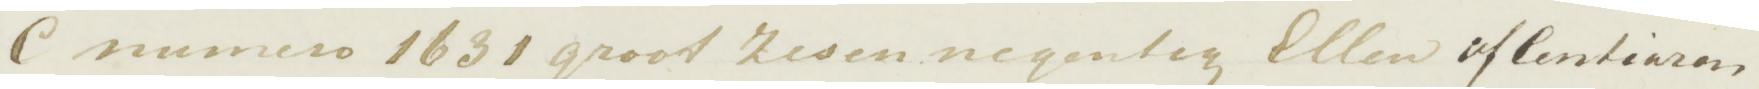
C numero 1631 groot zes en negentig Ellen of Centiaren
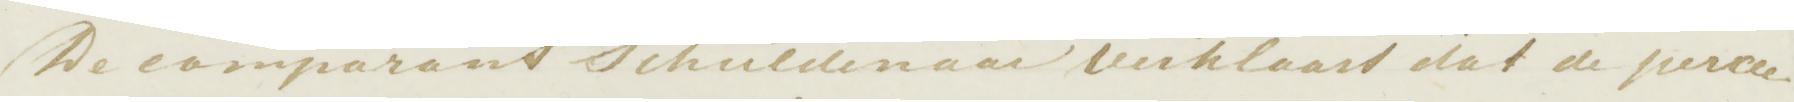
De comparant schuldenaar verklaart dat de percee
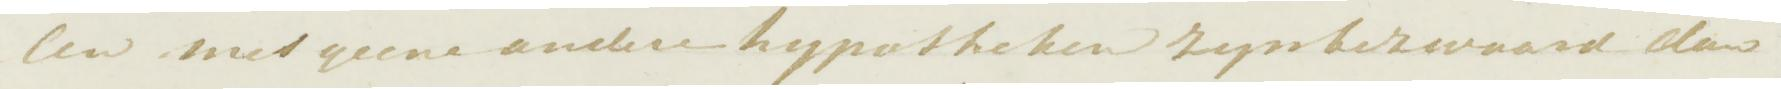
len, met geene andere hypotheken zyn bezwaard dan
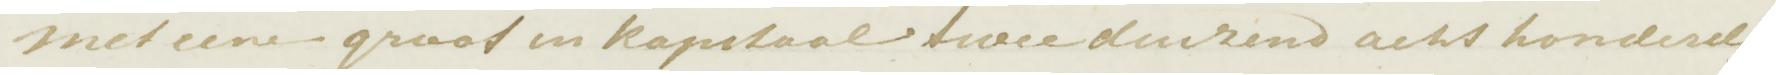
met eene groot in kapitaal twee duizend acht honderd
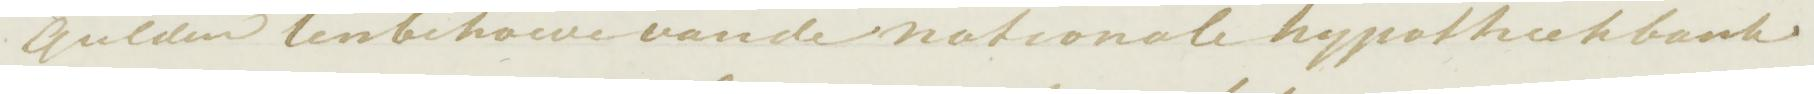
gulden ten behoeve van de nationale hypotheekbank
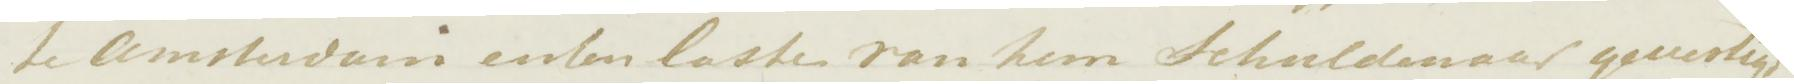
te Amsterdam en ten laste van hem schuldenaar gevestigd
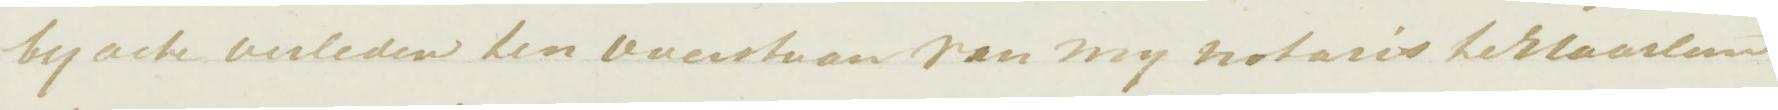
bij acte verleden ten overstaan van my notaris te Haarlem
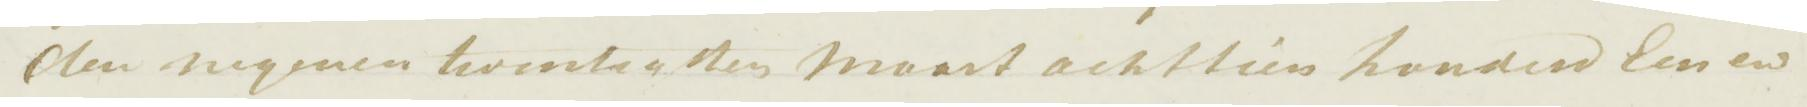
den negenen twintigsten maart achttien honderd Een en
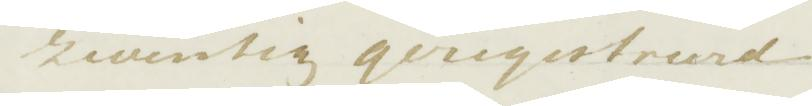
zeventig geregistreerd
